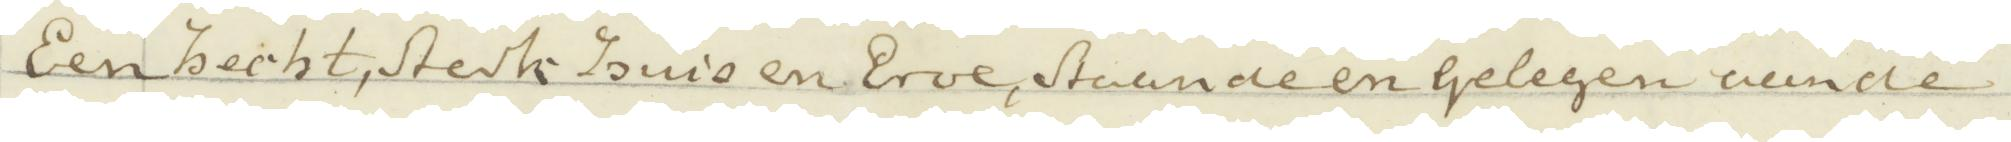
Een Hecht, Sterk Huis en Erve staande en Gelegen aan de
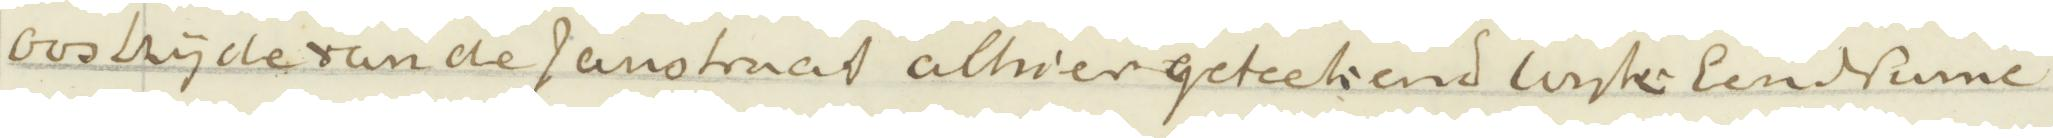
Oostzijde van de Janstraat alhier geteekend Wyk Een Nume
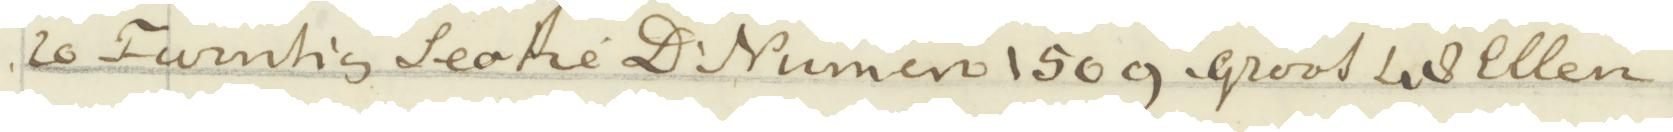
ro Twintig Sectie D Numero 1509 groot 48 Ellen
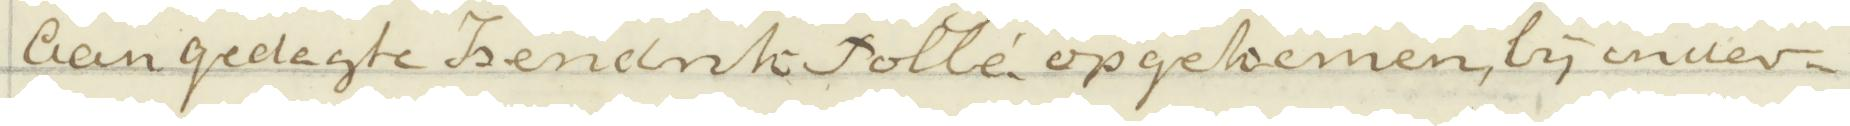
Aan gedagte Hendrik Pollé opgekomen, bij onder
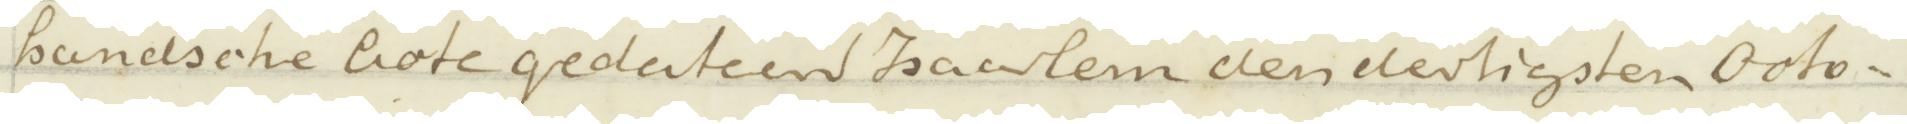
handsche Acte gedateerd Haarlem den dertigsten Octo-
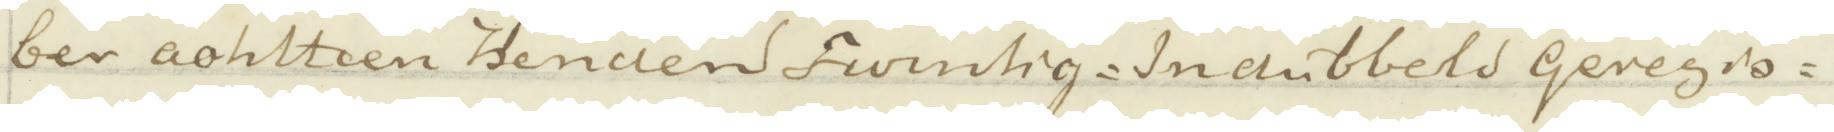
=ber achttien honderd Twintig- In dubbeld Geregis=
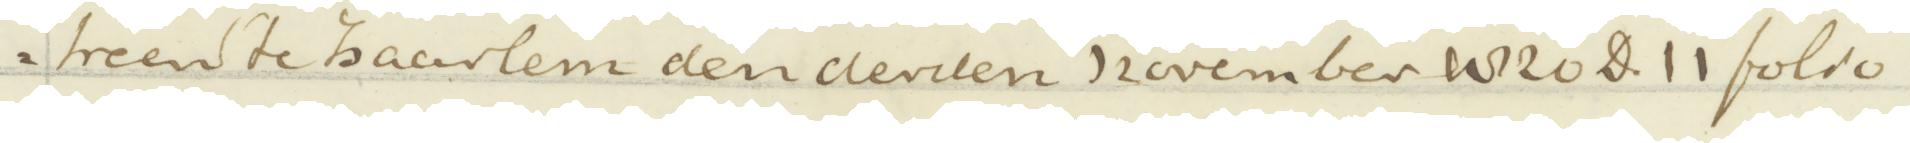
=treerd te Haarlem den derden November 1820 D 11 folio
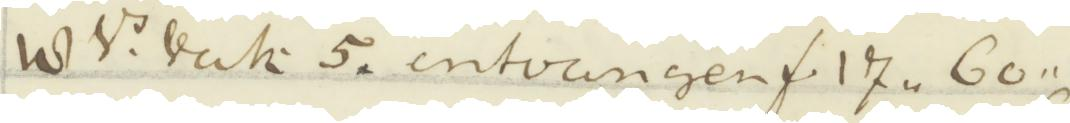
18 V.o Vak 5. ontvangen f. 17„ 60„
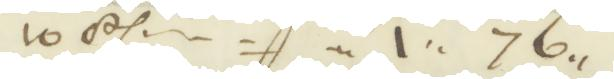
10 o:'C - - - „ 1„ 76„
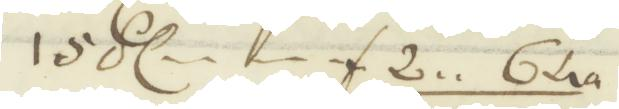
15 o:'C - - - - - f. 2„. 64
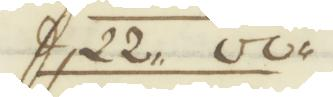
f 22„ 00„
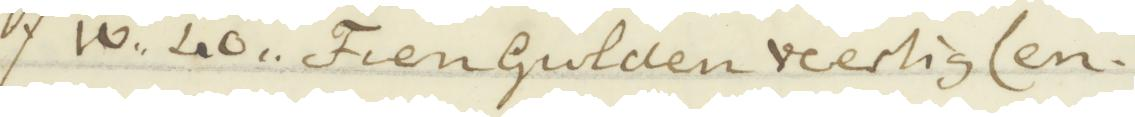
ƒ 10„ 40„ Tien Gulden veertig Cen-
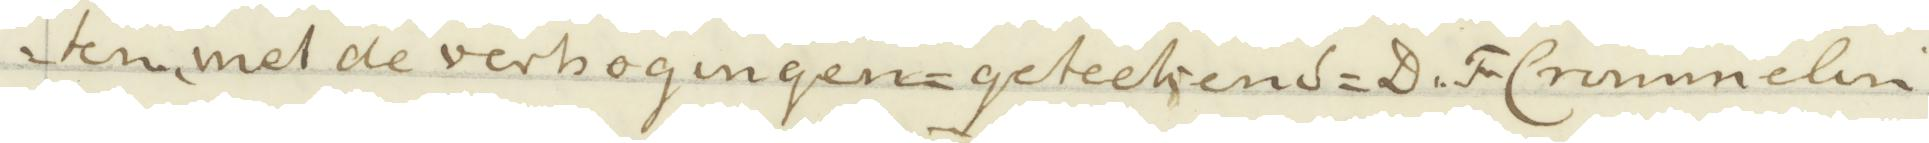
-ten met de verhogingen geteekend= D. F Crommelin
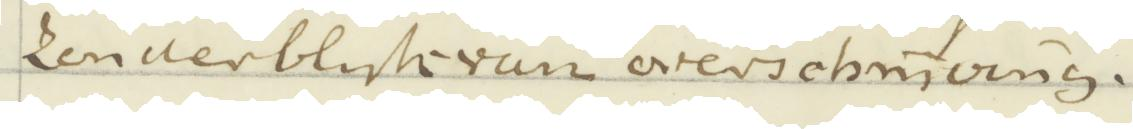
Zonder blyk van overschrijving.
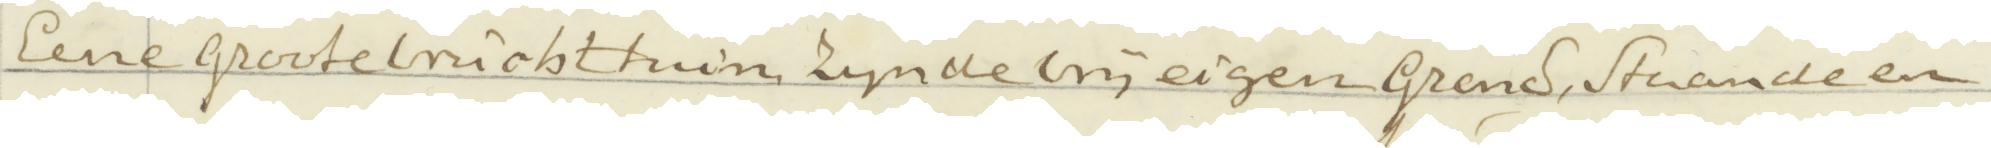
Eene groote vruchtuin Zynde vrij eigen Grond, Staande en
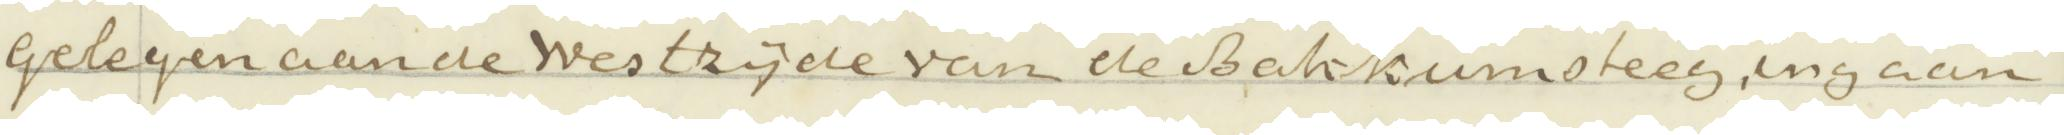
Gelegen aan de Westzijde van de Bakkumsteeg, ingaan
